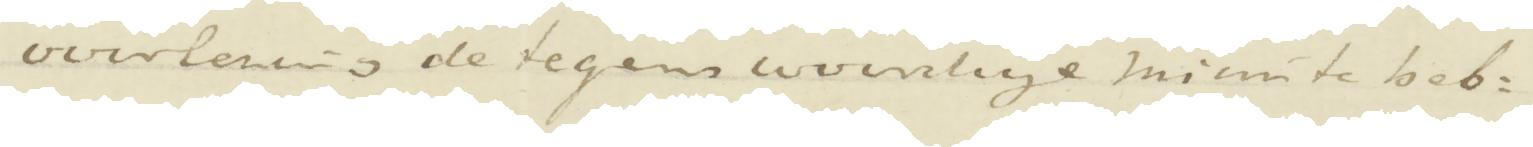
voorlezing de tegenswoordige minute heb=
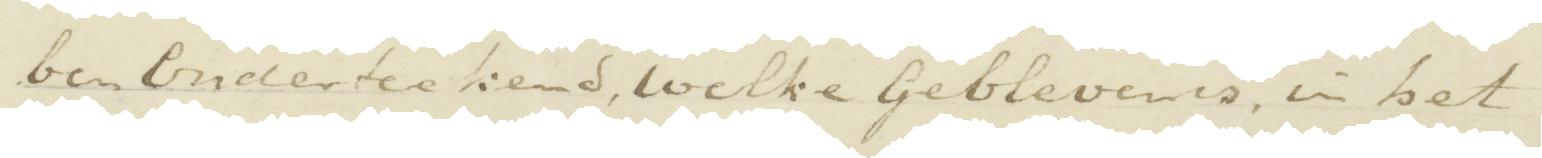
ben Onderteekend, welke Gebleven is, in het
